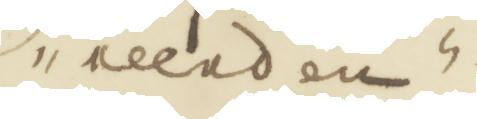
„reerden"
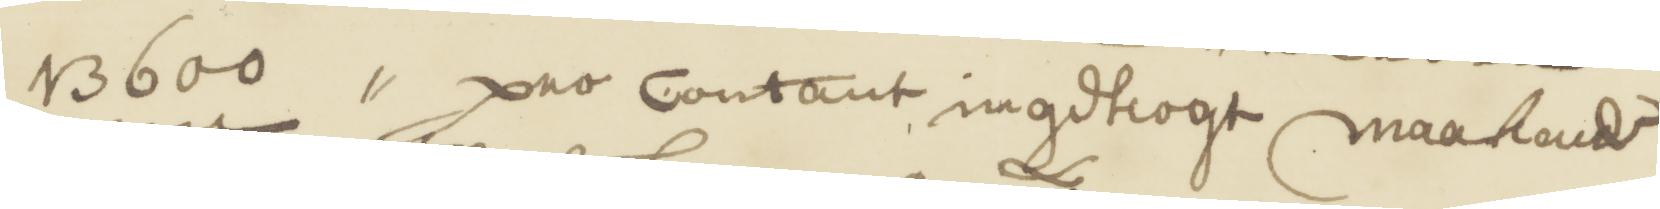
13600 „ pro contant ingekogt maakende
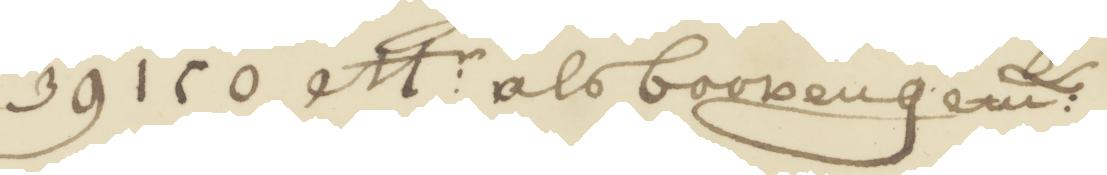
39150 M:n als boovengem:e
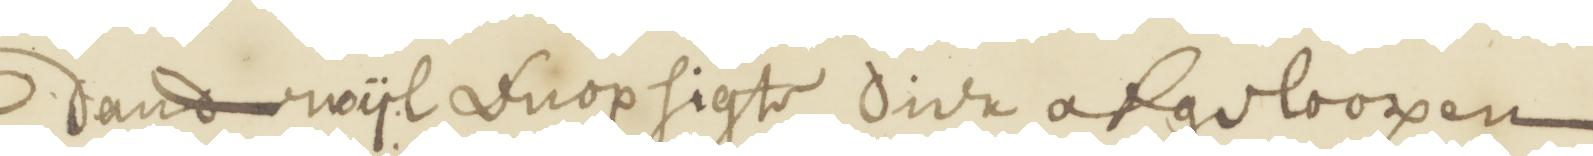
dan dewijl ten opsigte dier afgeloopen
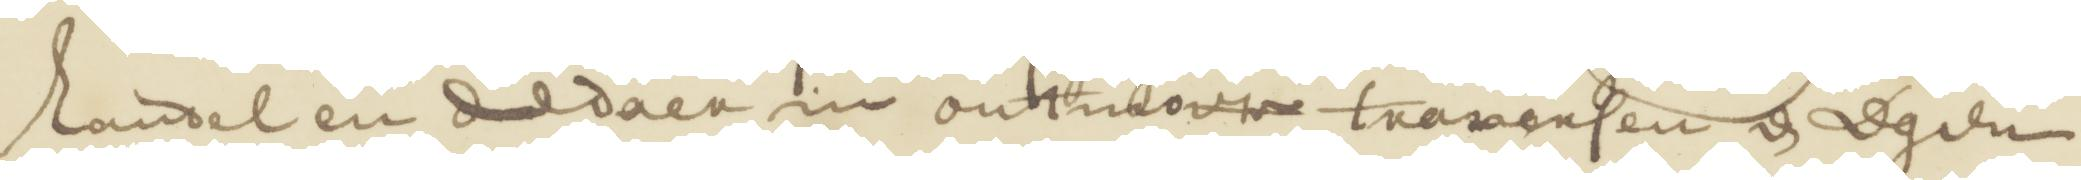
handel en de daerin ontmoete traversen en tegen
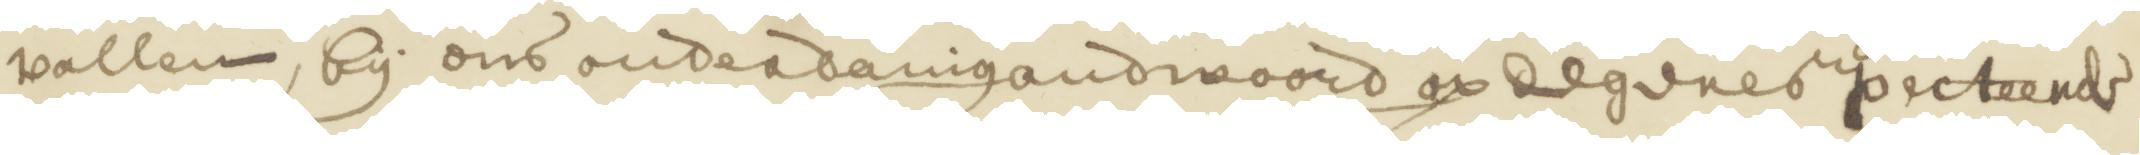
vallen, bij ons onderdanig andwoord op de gerespecteerde
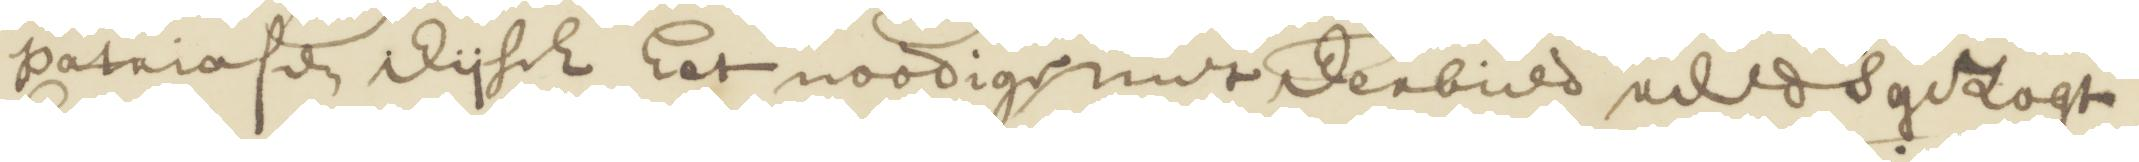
patriasen Eijsch het noodige met Eerbied reeds gezogt
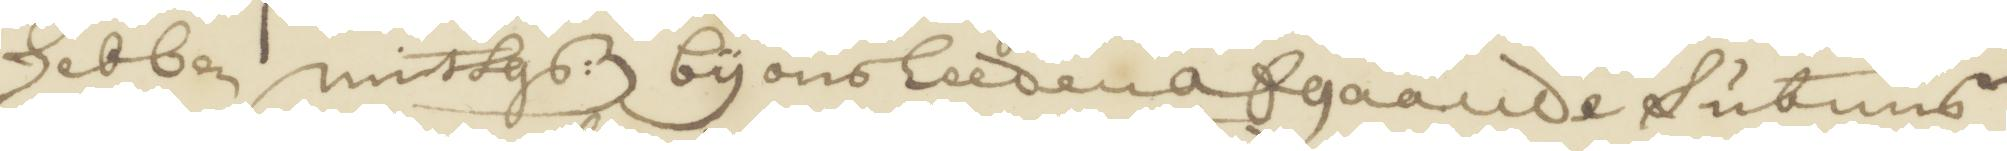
hebben mitsgs: bij ons heeden afgaande submis
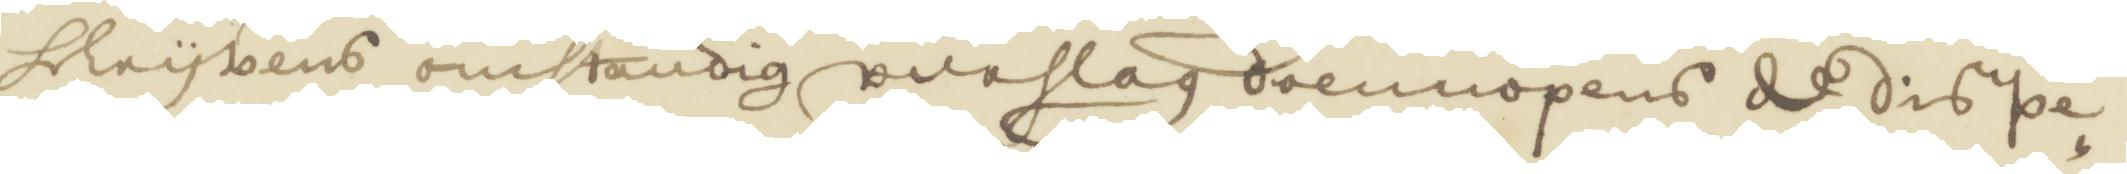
schrijvens omstandig verslag doen nopens de dispe„
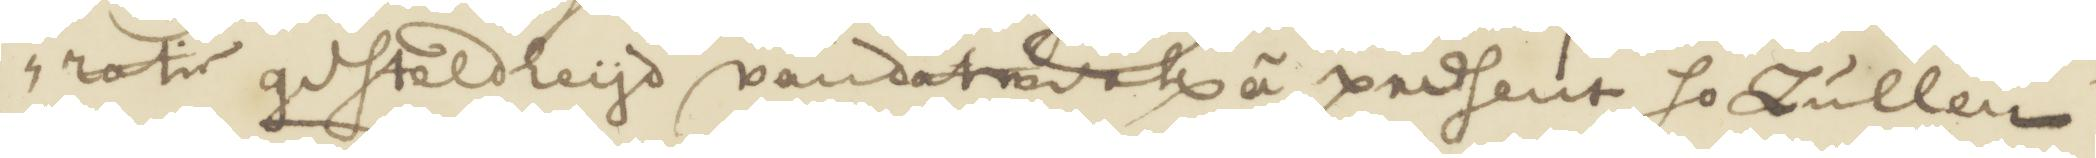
„ratie gesteldheijd van dat werk â present So Zullen
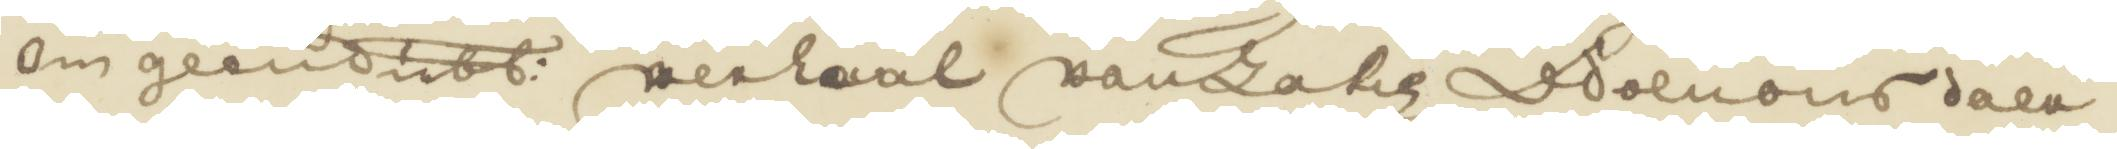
om geen dubb: verhaal van Zake te doen ons daer
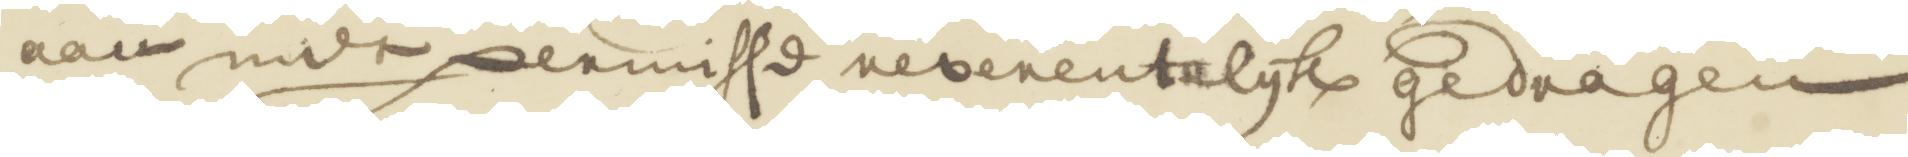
aan met permisse reverentelijk gedragen
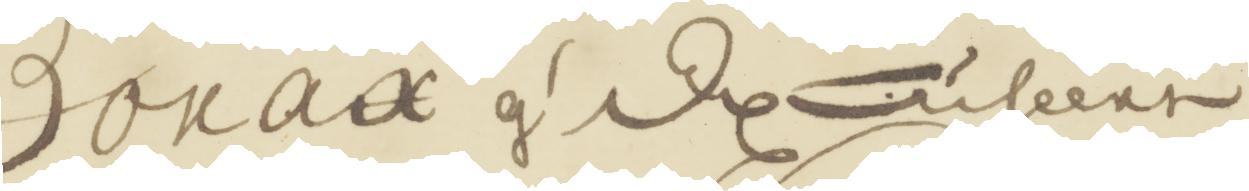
Borax g’Excuseert
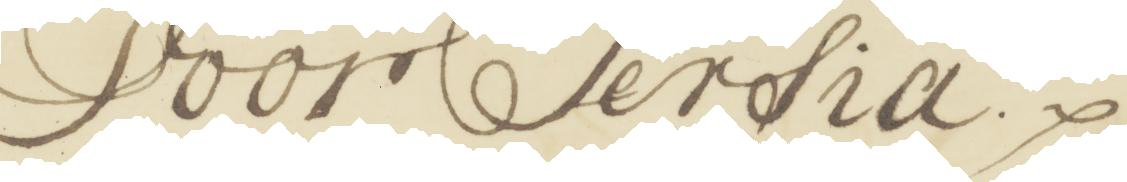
Voor Persia.
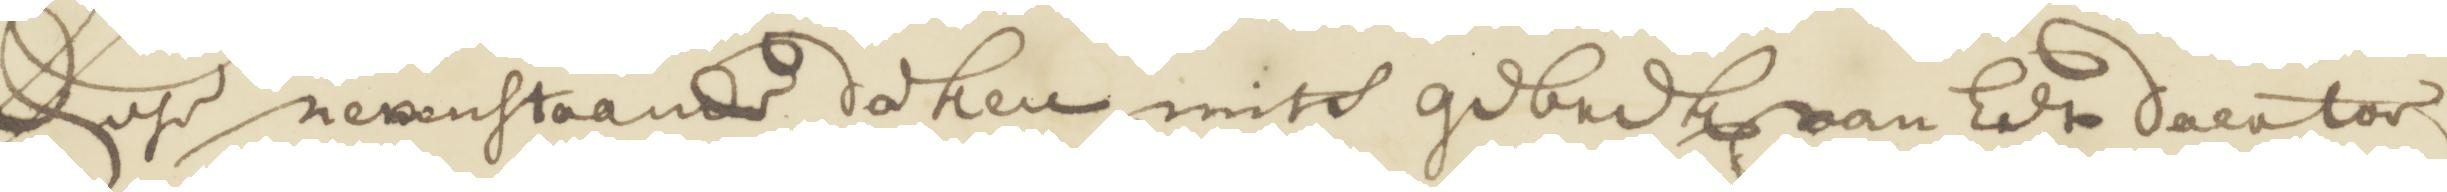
Dese nevenstaande doeken mits gebrek van het daer toe
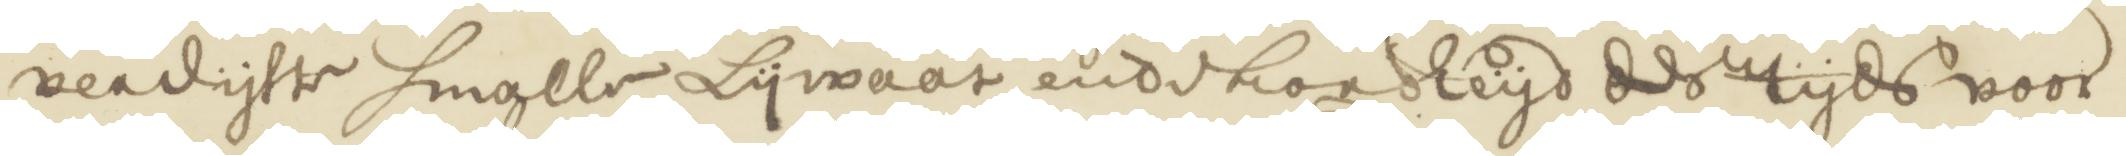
vereijste Smalle Lijwaat ende kordheijd des tijds voor
